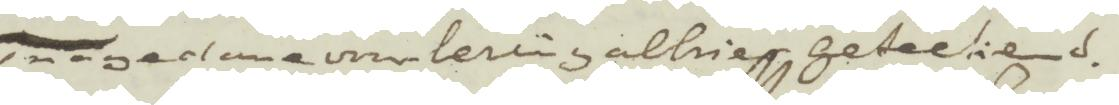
nagedane voorlezing alhier geteekend.
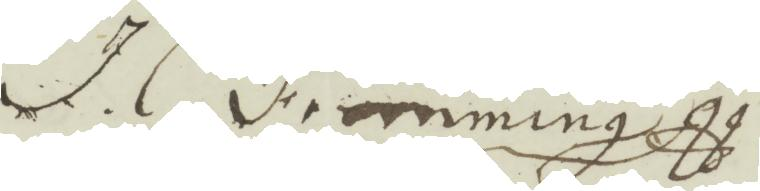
J.G. Fremming
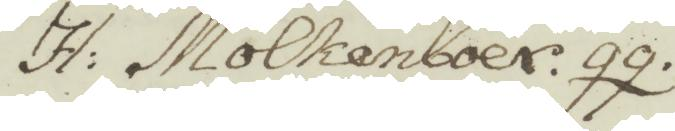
H: Molkenboer. 99.
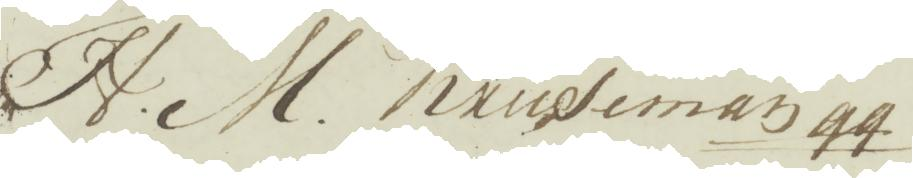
H: M. Krüseman 44
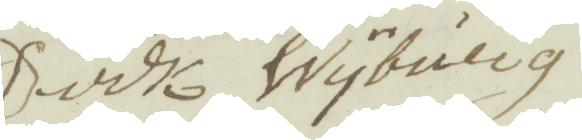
Dirk Wijburg
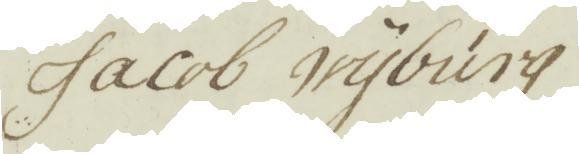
Jacob wijburg
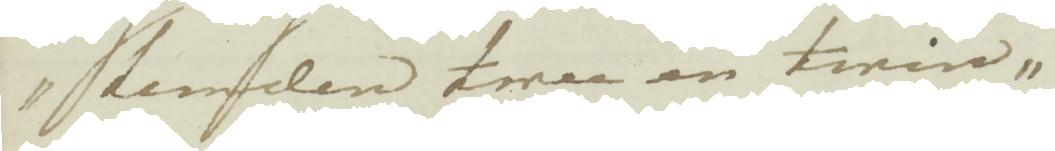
„lem den twee en twin„
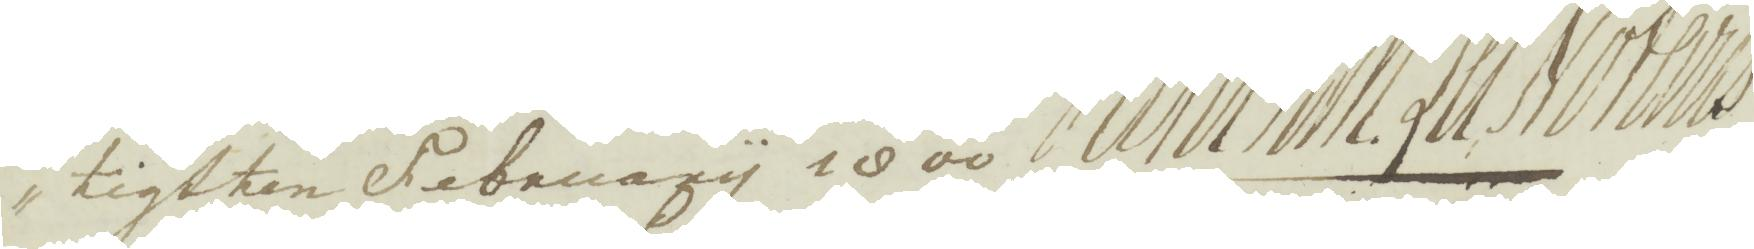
„tigsten Februarij 1800 Pieter van Leè, Notaris
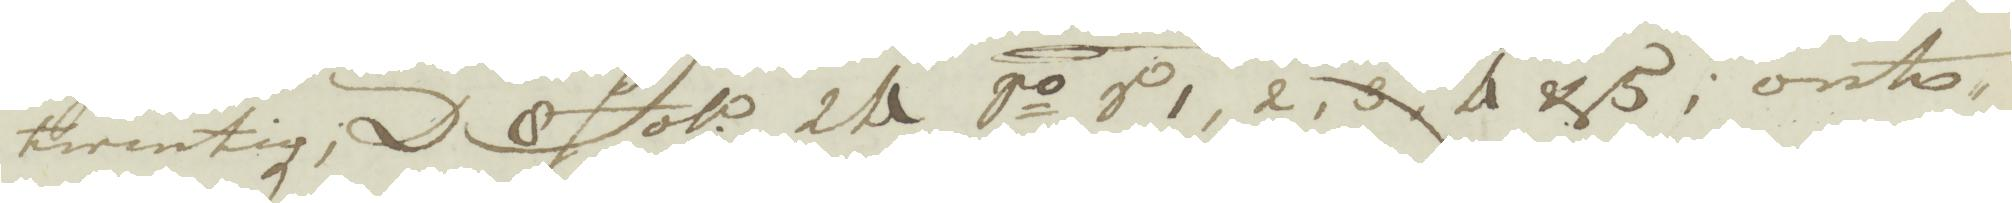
twintig; D 8 fol.o 24 v=o v 1, 2, 3, 4 & 5; ont„
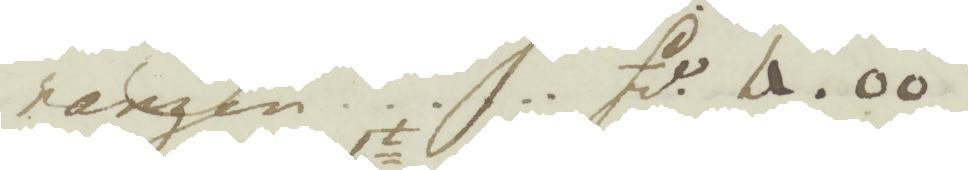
vangen . . . . . . fr. 4.00
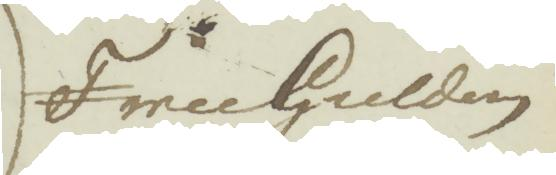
Twee Gulden
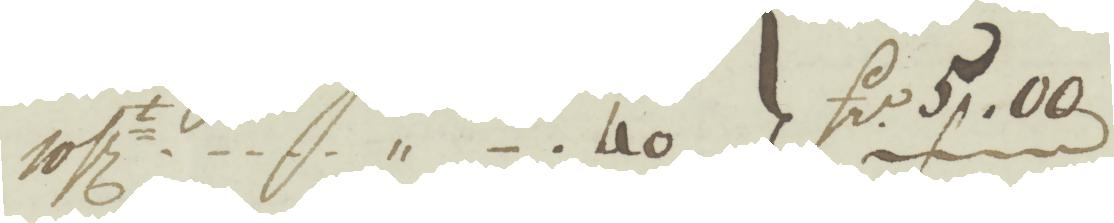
10 /c=t - - - - - „ – . 40 fr. 5.00
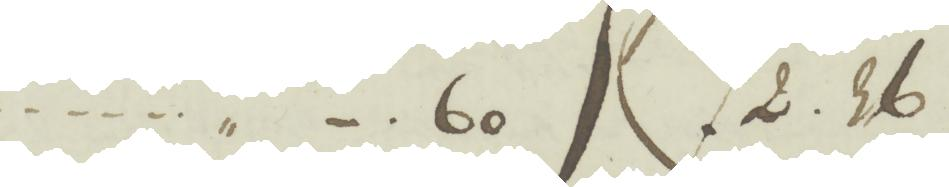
15 /c=t - - - - . „ – . 60 ƒ2.36
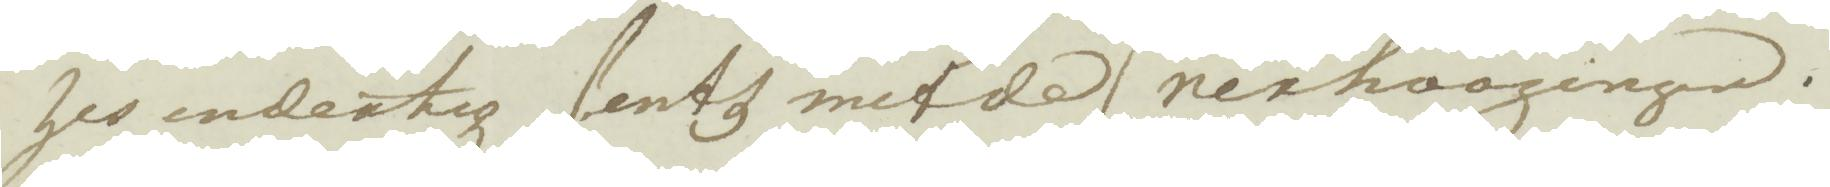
Zes endertig Cents met de verhoogingen.
